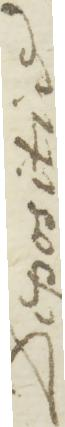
Depositie
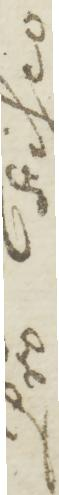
Pro Fisco
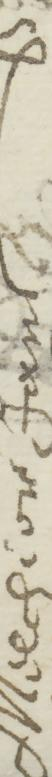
Melchior Jansz
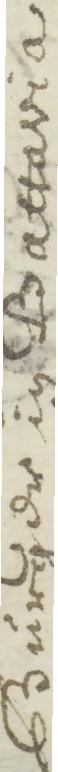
Burger in Battavia
